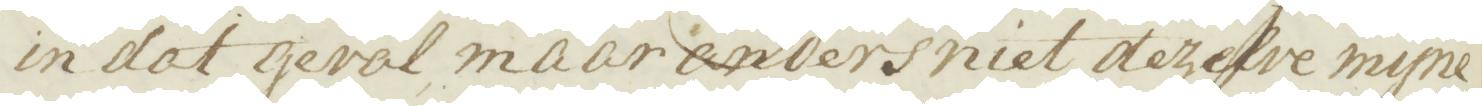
in dat geval maar anders niet, dezelve mijne
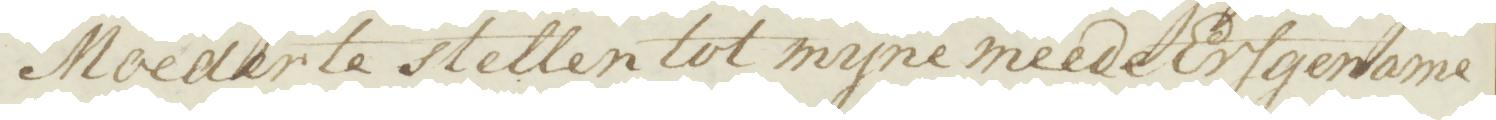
Moeder te stellen tot mijne meede Erfgename
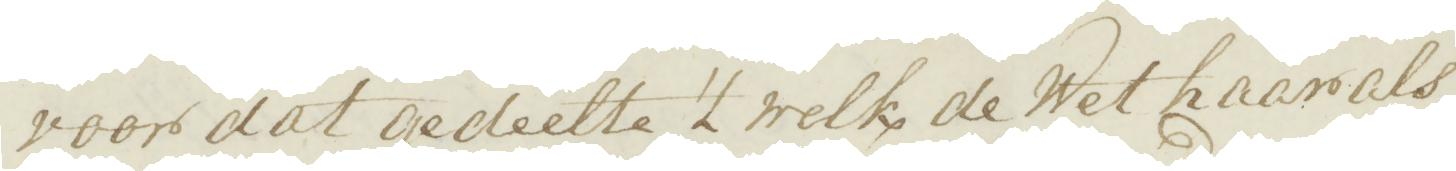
voor dat gedeelte ’t welk de wet haar als
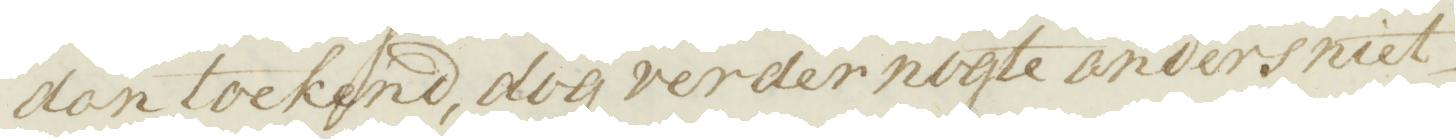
dan toekend, dog verder nogte anders niet
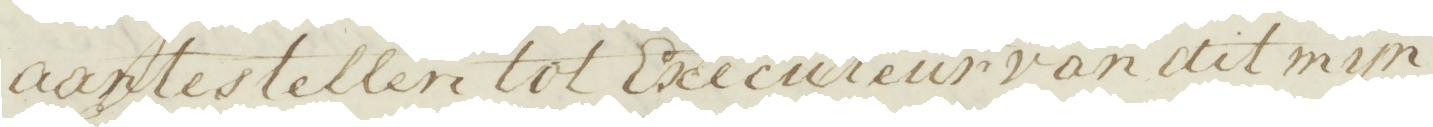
aantestellen tot Executeur van dit myn
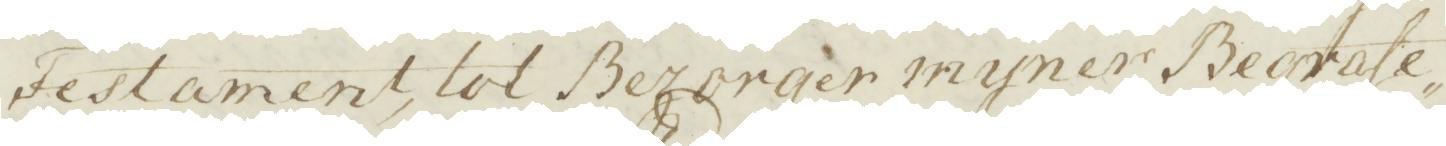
Testament, tot Bezorger mijner Begrafe„
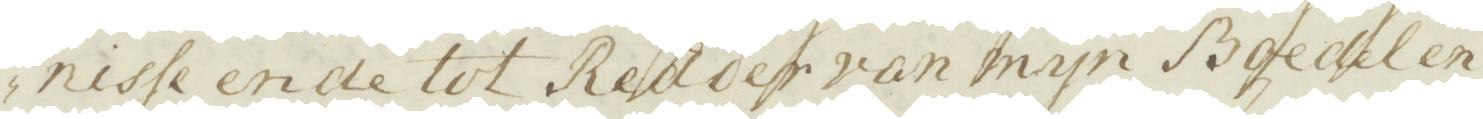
„nisse en de tot Redder van mijn Boedel en
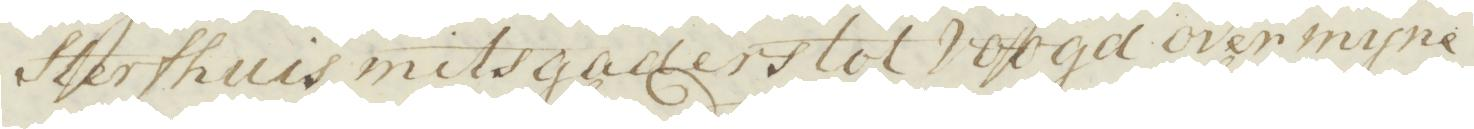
Sterfhuis, mitsgaders tot Voogd over mijne
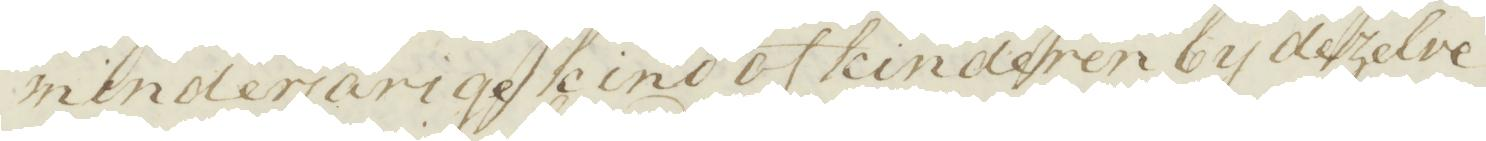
minderjarige kind of kinderen bij dezelve
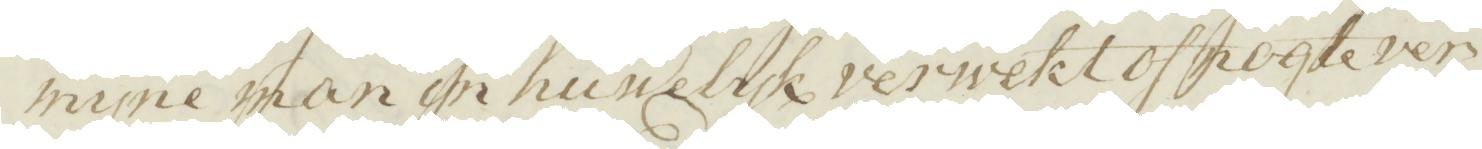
myne man in huwelyk verwekt of nog te ver
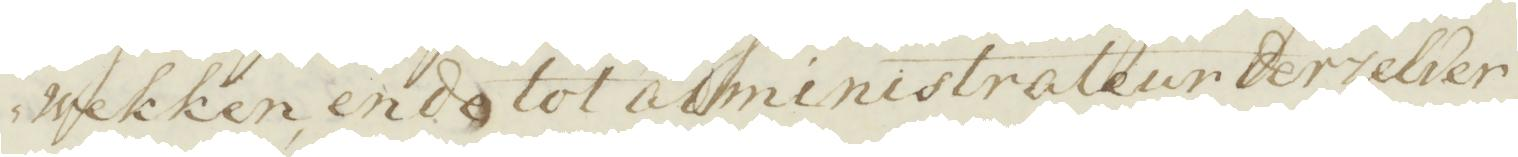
„wekken, ende tot administrateur derzelver
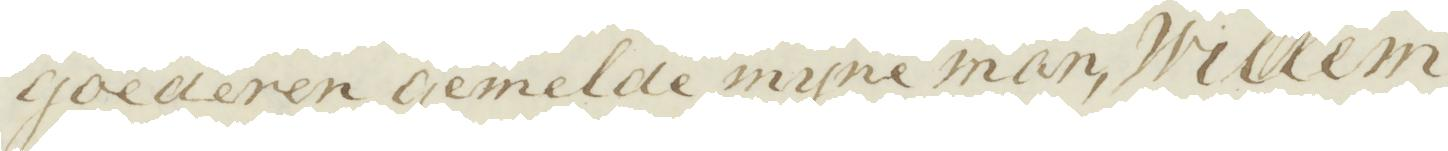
goederen, gemelde myne man, Willem
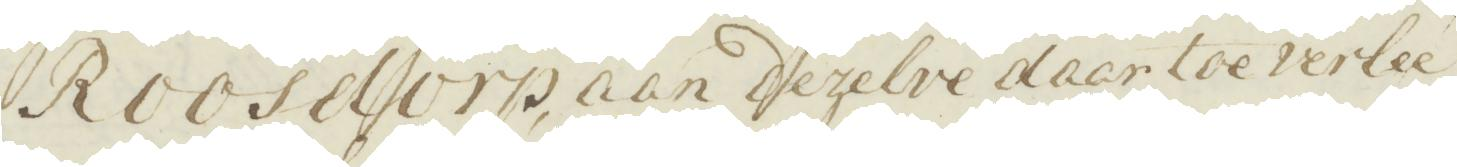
Roosdorp, aan dezelve daar toe verlee
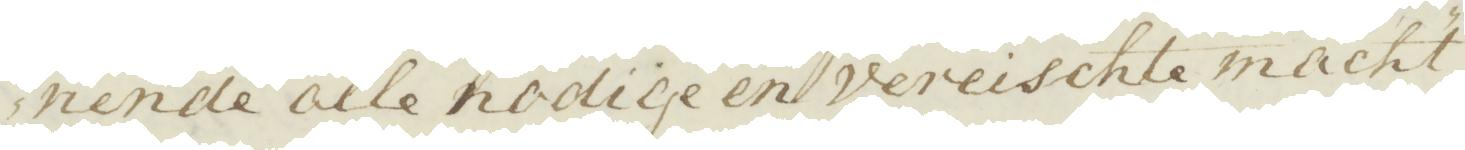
„nende alle nodige en vereischte macht
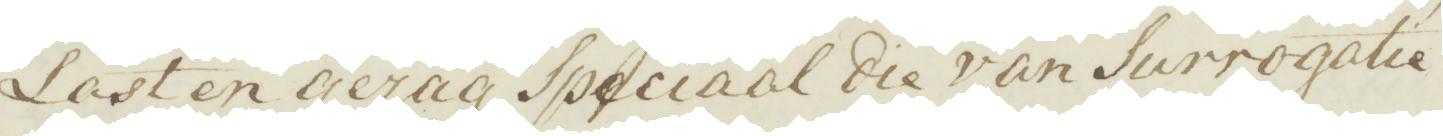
Last en gezag, Speciaal die van Surrogatie
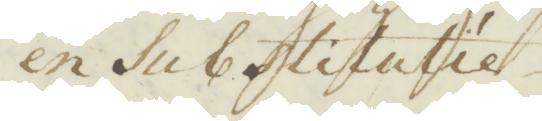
en Substitutie.
